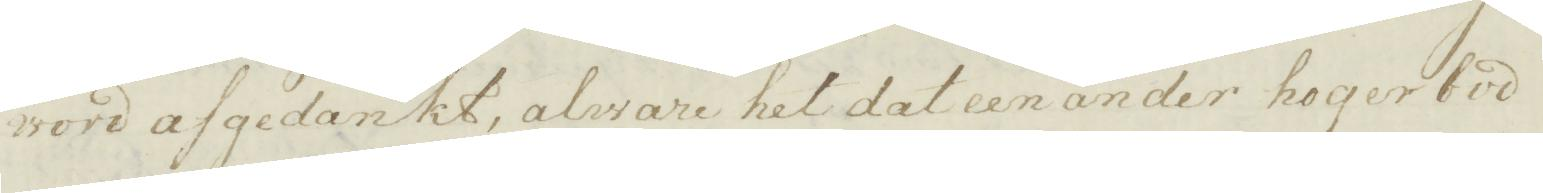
word afgedankt, alware het dat een ander hoger bod
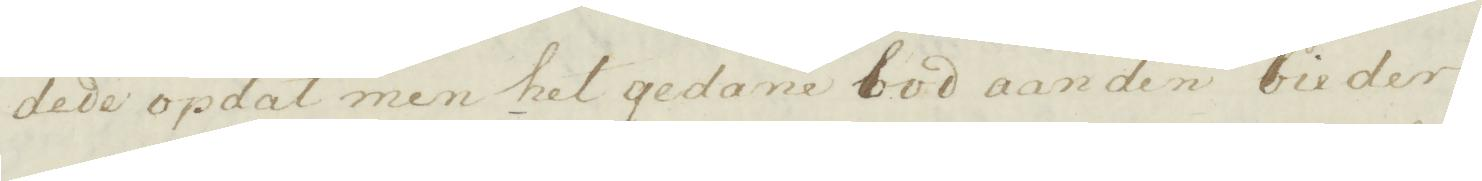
dede opdat men het gedane bod aan den bieder
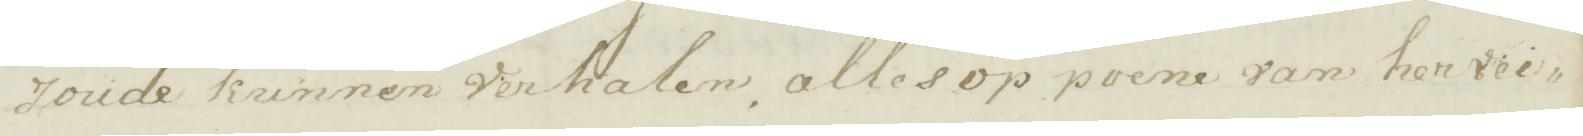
zoude kunnen verhalen, alles op poene van her vei„
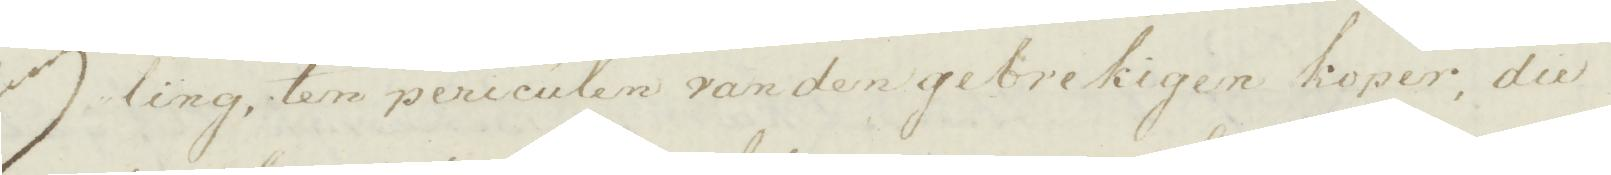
„ling, ten periculen van den gebrekigen koper, die
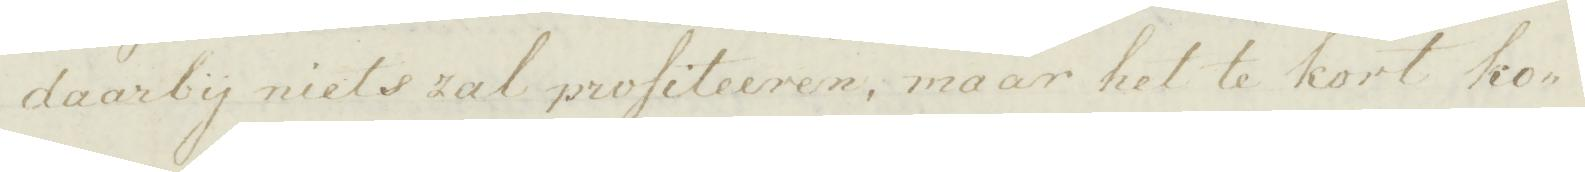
daarbij niets zal profiteeren, maar het te kort ko„
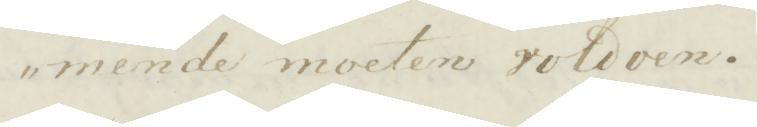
„mende moeten voldoen.
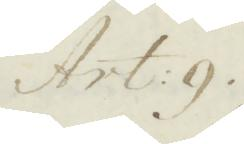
Art:9.
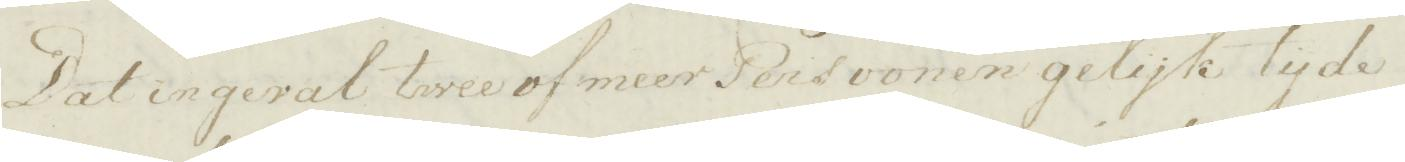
Dat ingeval twee of meer Persoonen gelijk tijde
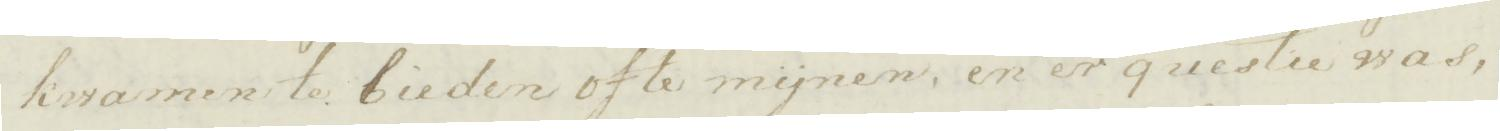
kwamen te bieden of te mijnen, en er questie was,
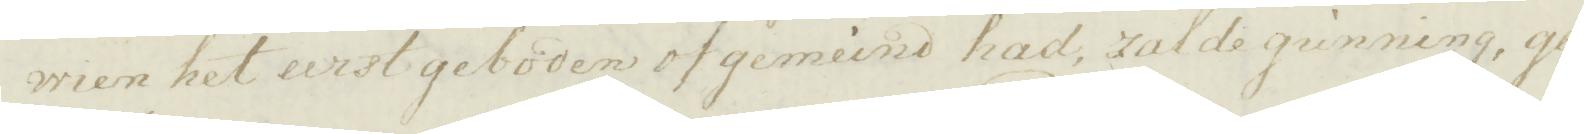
wien het eerst geboden of gemeind had, zal de gunning, ge:
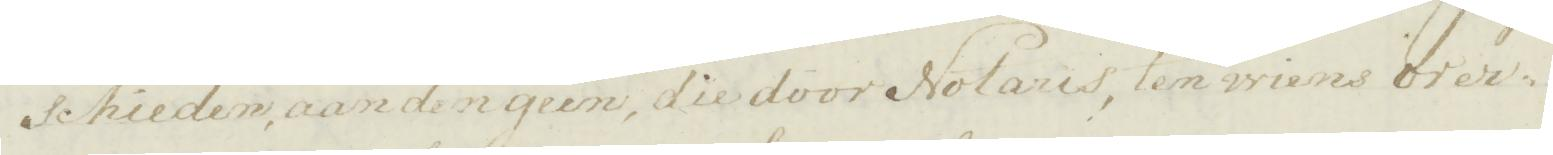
schieden, aan den geen, die door Notaris, ten wiens over„
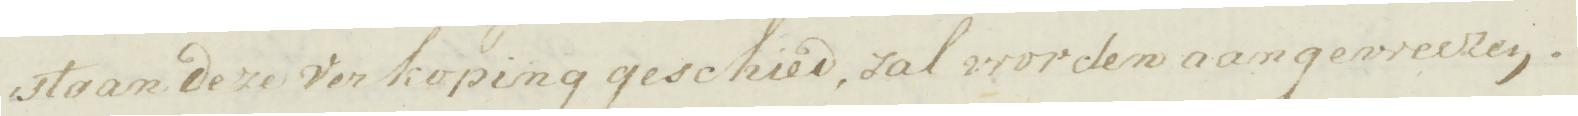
,staan deze verkoping geschied, zal worden aangeweezen.
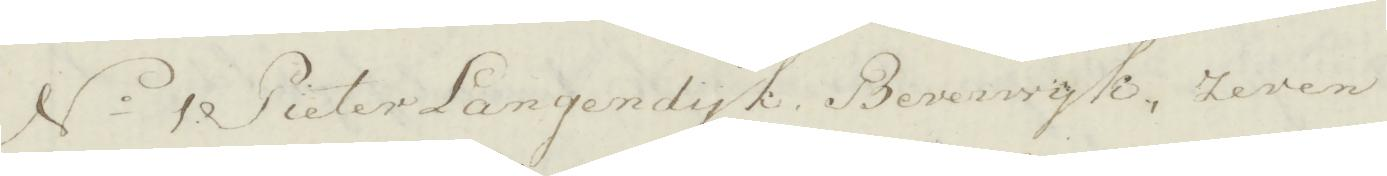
N_o 1. Pieter Langendijk, Beverwijk, zeven
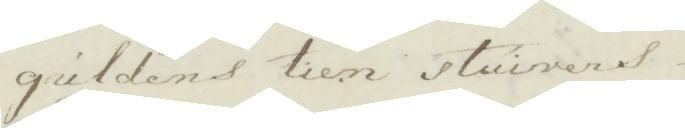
guldens tien stuivers
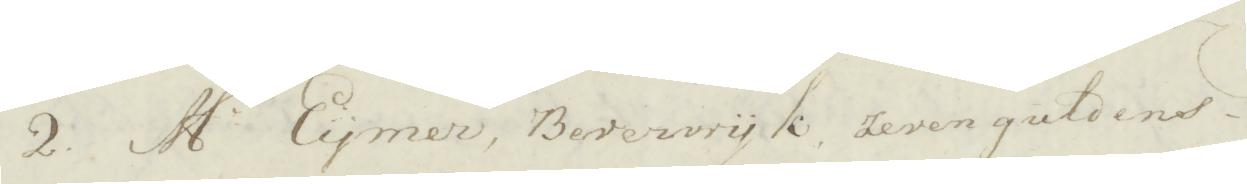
2. M: Eijmer, Beverwijk, zeven guldens
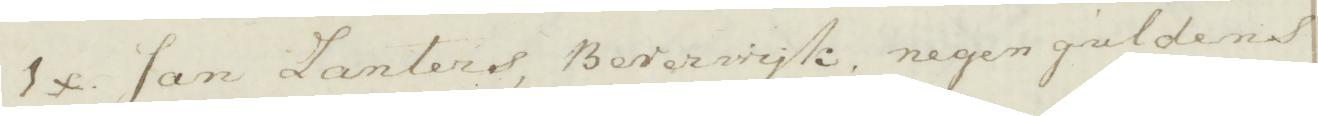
1x. Jan Zanters, Beverwijk, negen guldens
